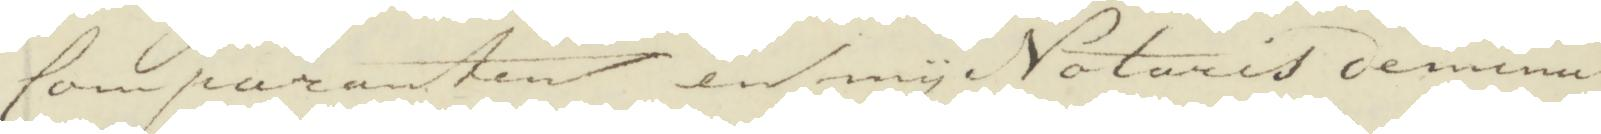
Comparanten en mij Notaris deminu
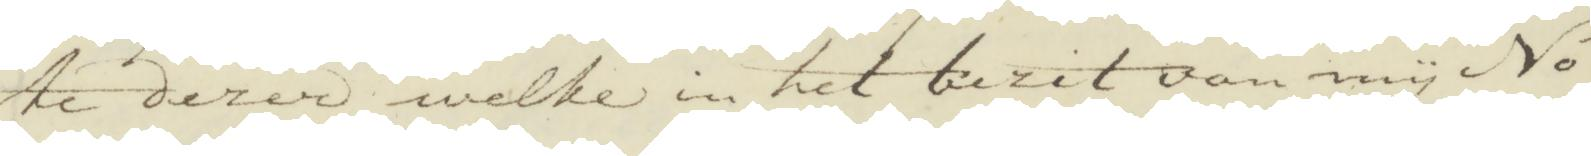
te dezer welke in het bezit van mij No
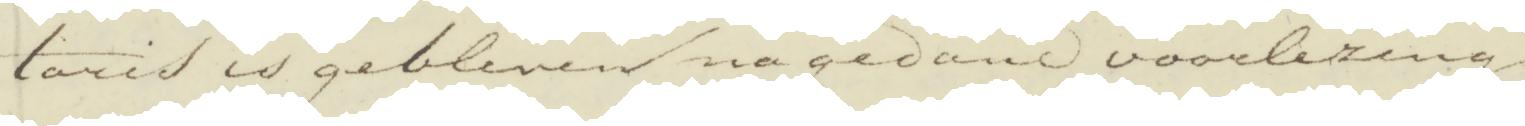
taris is gebleven na gedane voorlezing.
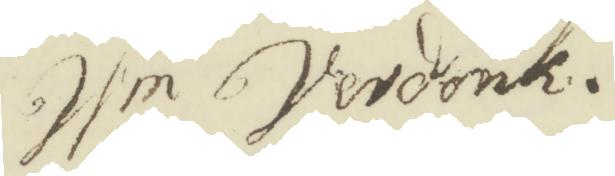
Wm Verdonk.
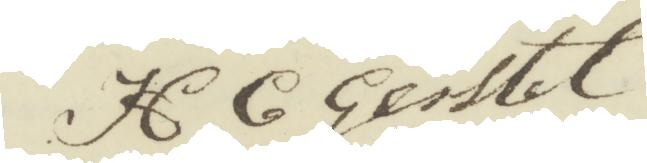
H C Gerstel
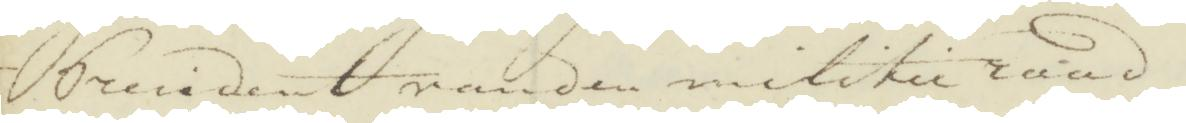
President van den militie raad
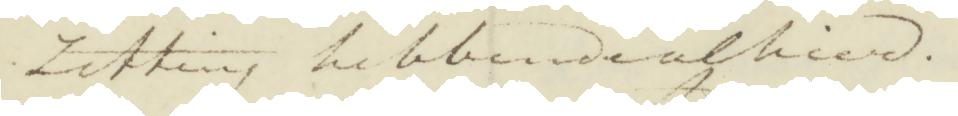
zitting hebbende alhier.
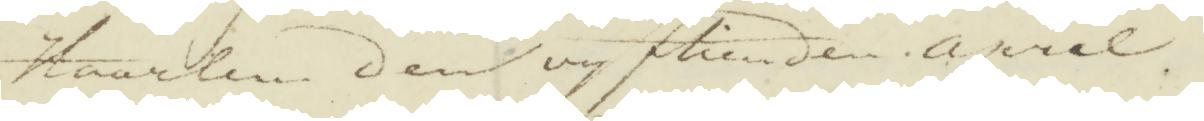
Haarlem den vyftienden april,
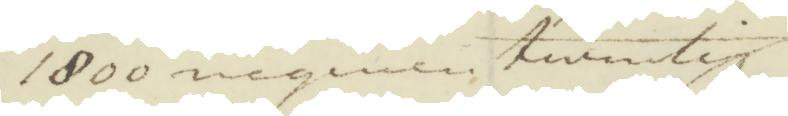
1800 negenen twintig
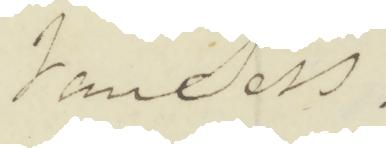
Van Pels.
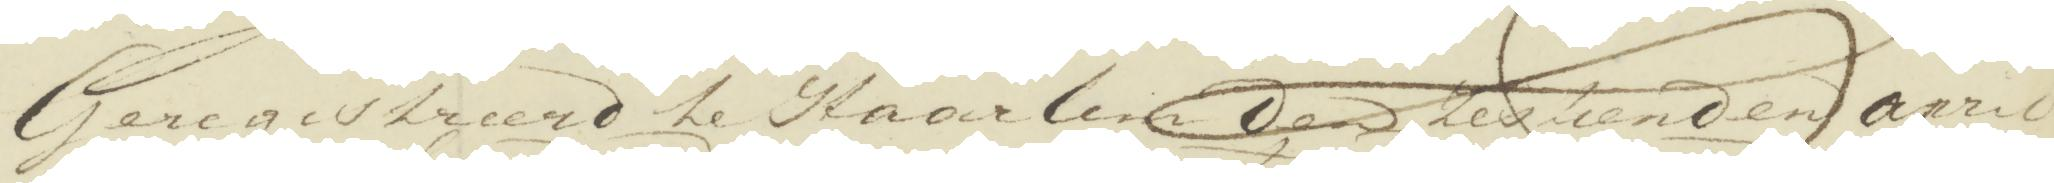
Geregistreerd te Haarlem den Zestienden april
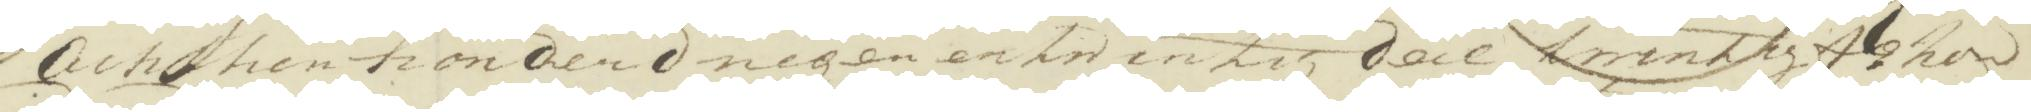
Achttienhonderd negen en twintig deel twintig f„o hon
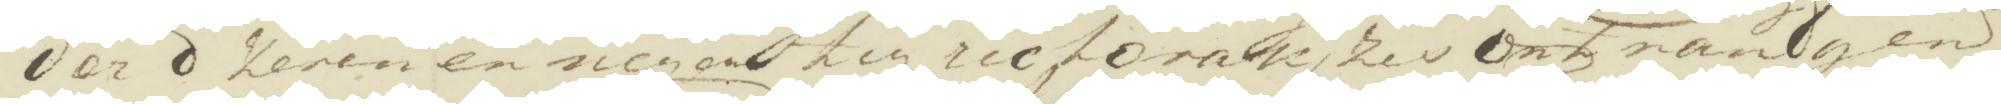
derd zeven en negentig recto vak zes ontvangen
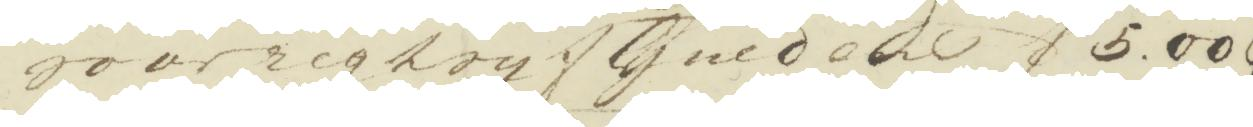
voor regtvyf Gulden ƒ 5.00
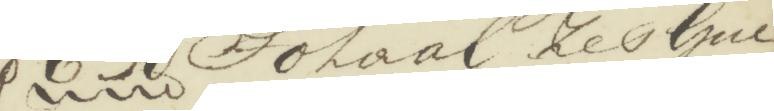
ƒ 6.30 Totaal Zes Gul
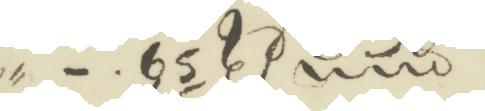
„ —.65
